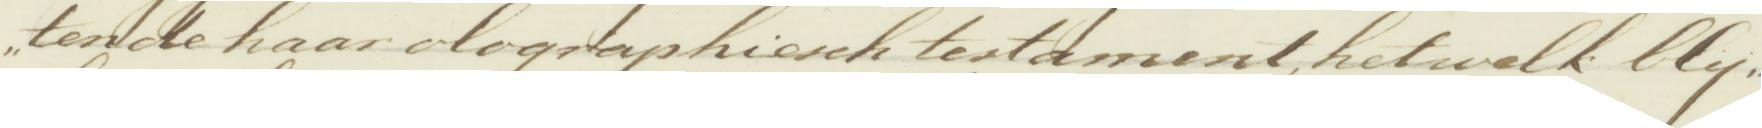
„tende haar olographiesch testament, het welk blij
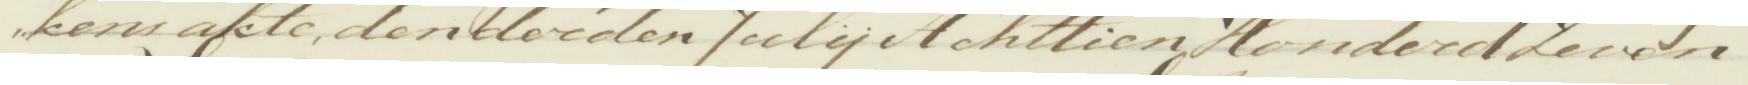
„kens akte, den derden Julij Achttien Honderd Zeven
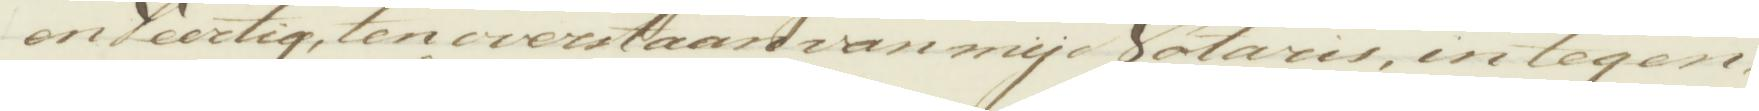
en Veertig, ten overstaan van mij Notaris, in tegen
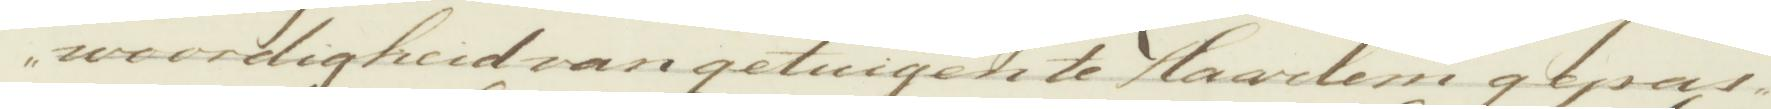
„woordigheid van getuigen te Haarlem gepas
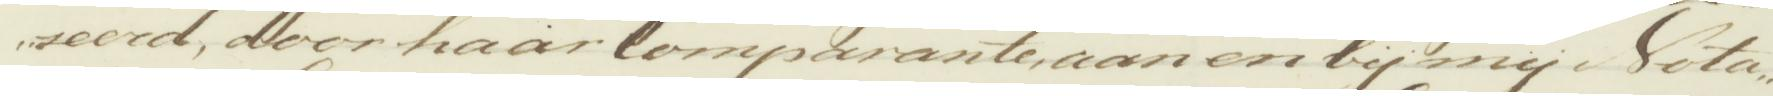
„seerd, door haar Comparante, aan en bij mij Nota
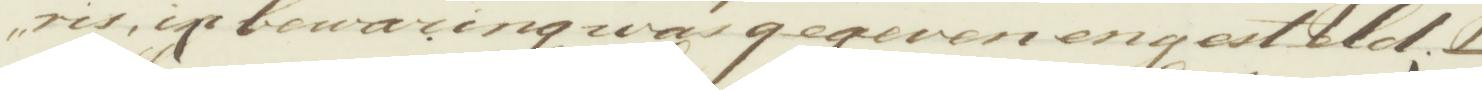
„ris, in bewaring was gegeven en gesteld.
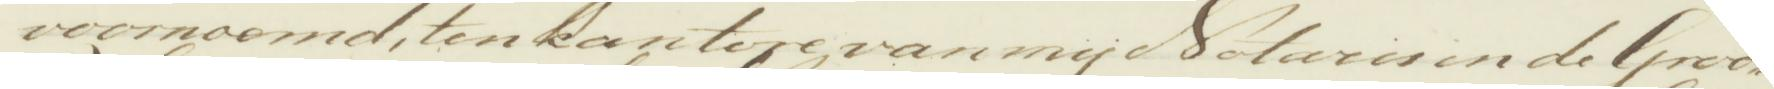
voornoemd, ten kantore van mij Notaris in de Groo„
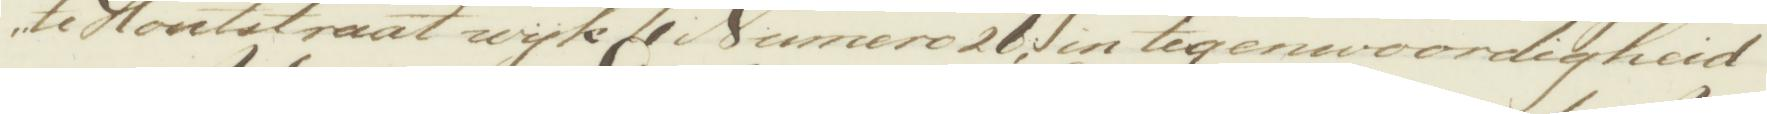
„te Houtstraat wijk 4 Numero 26, in tegenwoordigheid
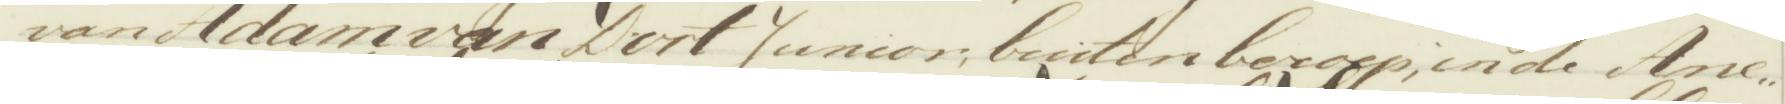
van Adam van Dort Junior, buiten beroep, in de Ane„
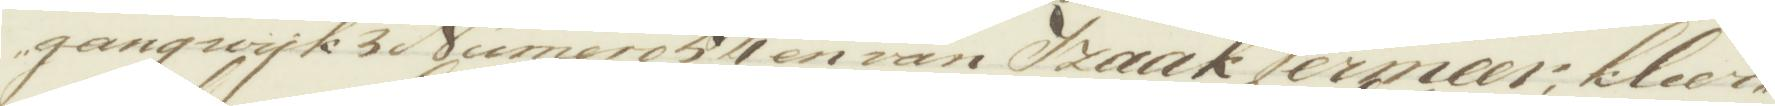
„gang wijk 3 Numero 54 en van Izaak Vermeer, kleer
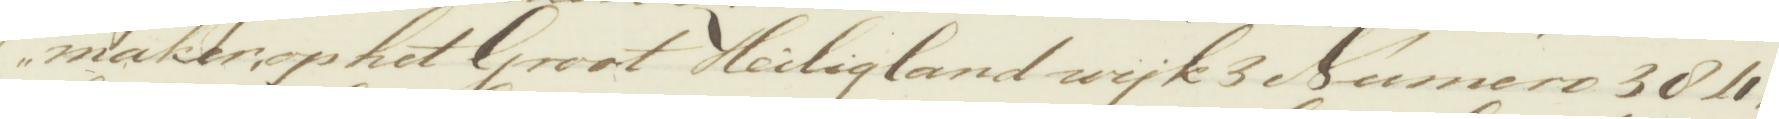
„maker, op het Groot Heiligland wijk 3 Numero 384,
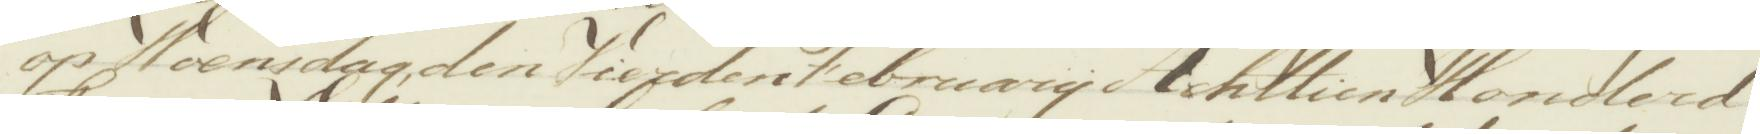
op Woensdag, den Vierden Februarij Achttien Honderd
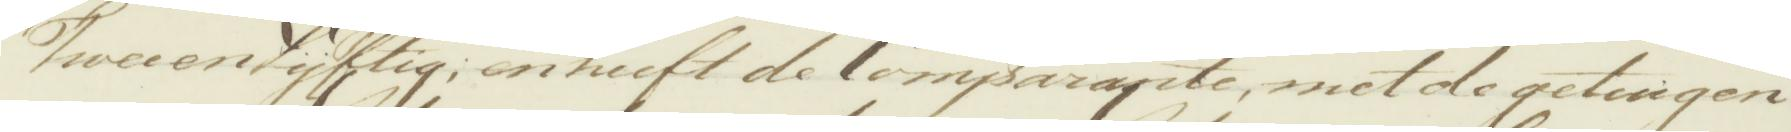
Twee en Vijftig; en heeft de Comparante, met de getuigen
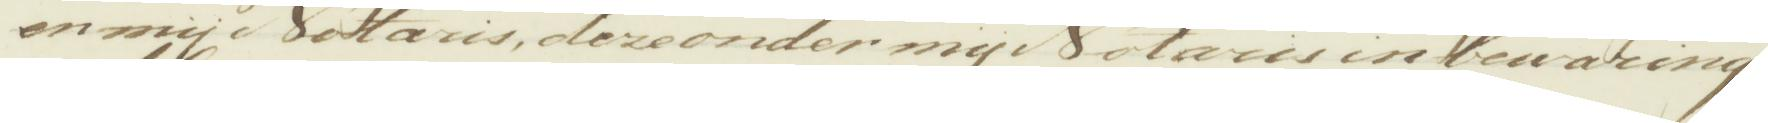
en mij Notaris, deze onder mij Notaris in bewaring
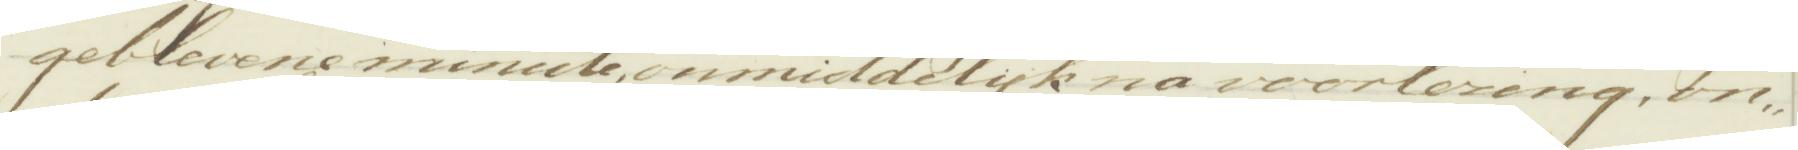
geblevene minute, onmiddelijk na voorlezing, on„
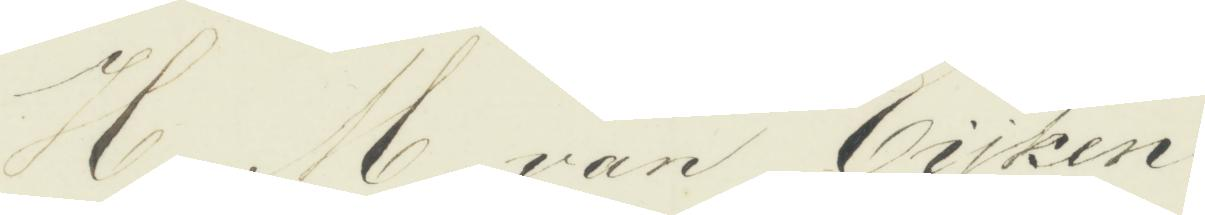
H. M. van Eijken
